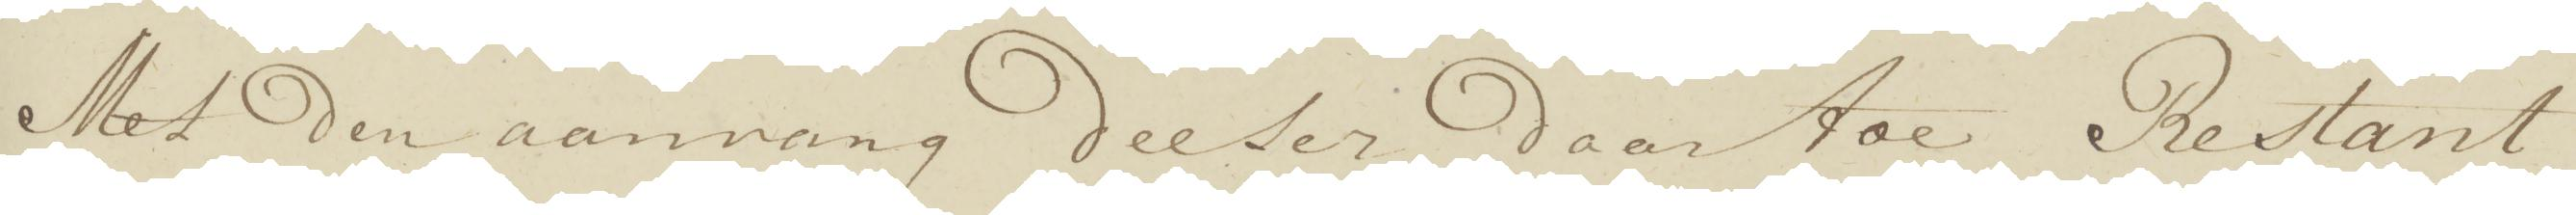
Met den aanvang deeser daartoe Restant
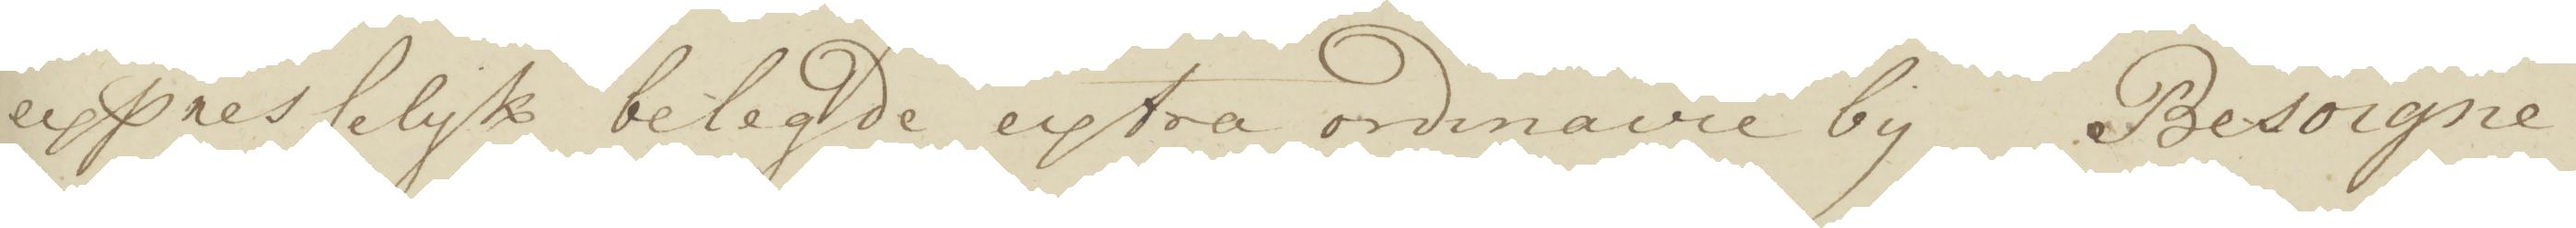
expresselyk belegde extra ordinaire by Besoigne
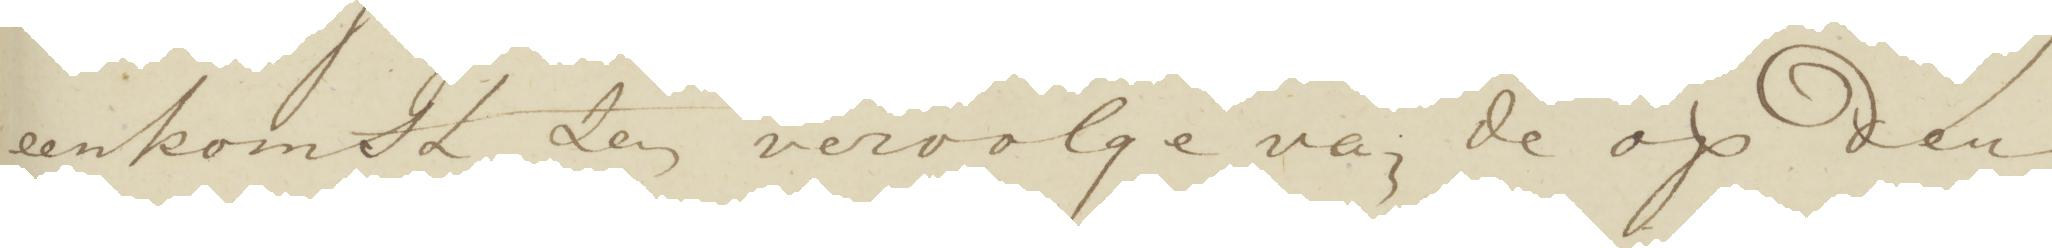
eenkomst ten vervolge van de op den
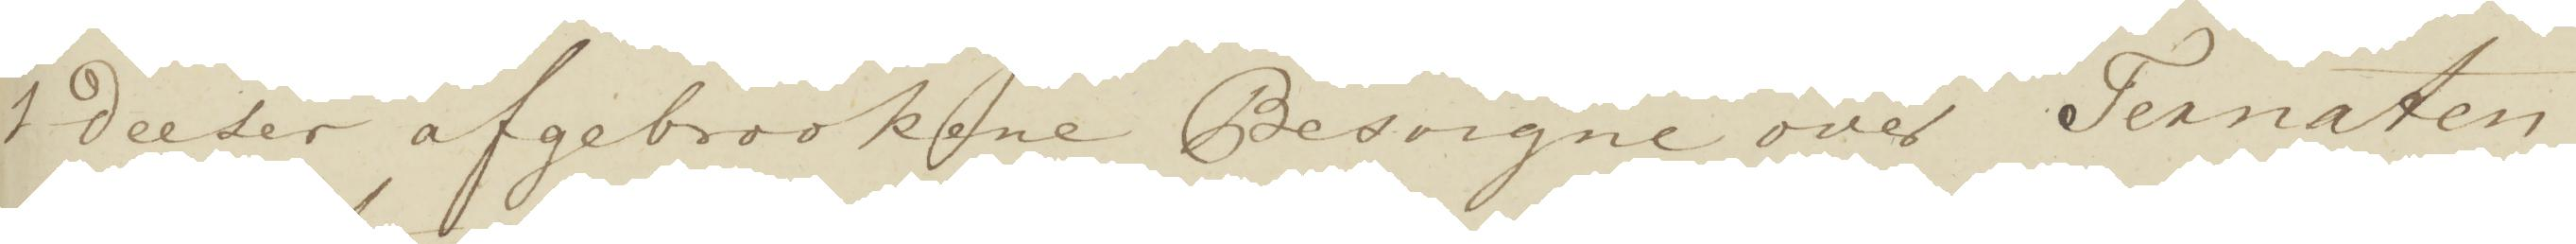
1 deeser afgebrookene Besoigne over Ternaten
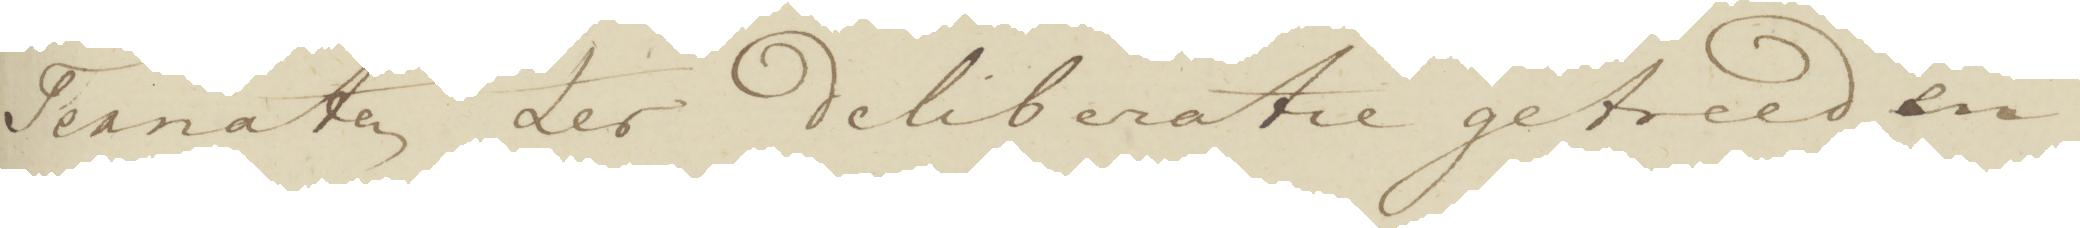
Ternaten, ter deliberatie getreeden
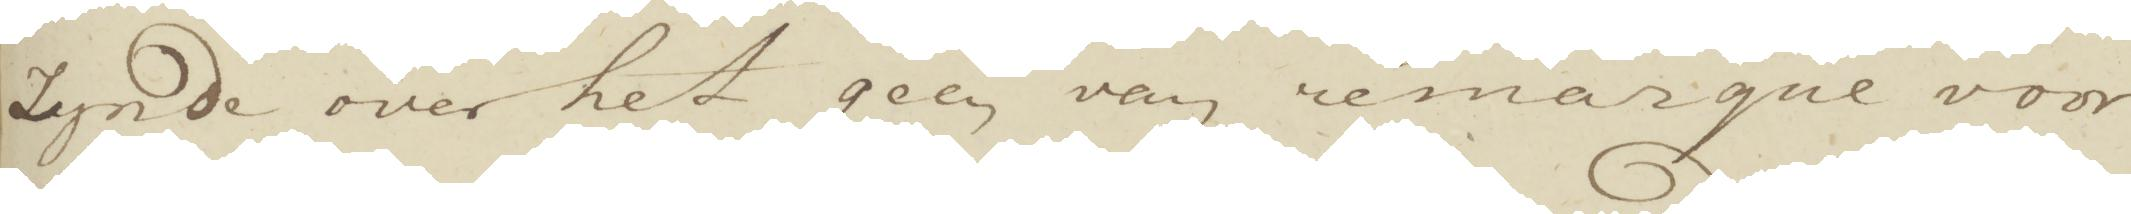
zynde over het geen van remarque voor
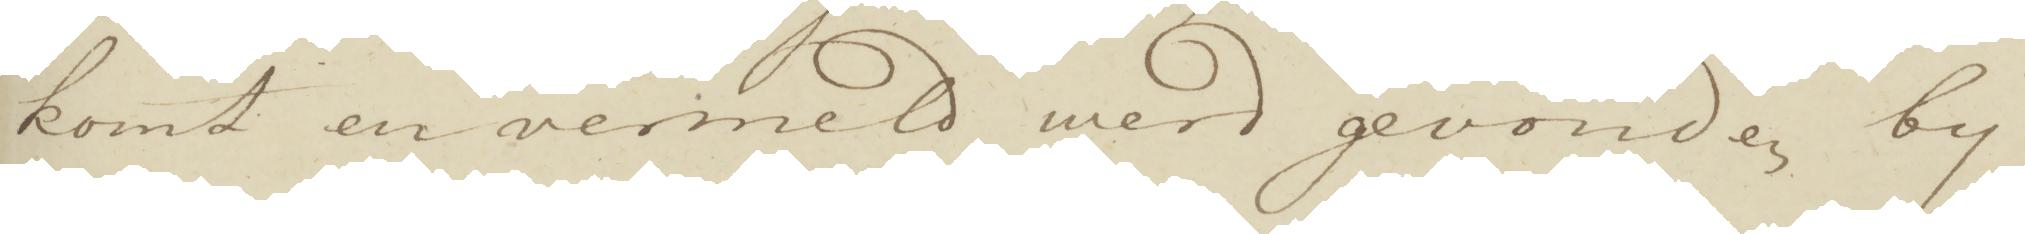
komt en vermeld werd gevonden bij
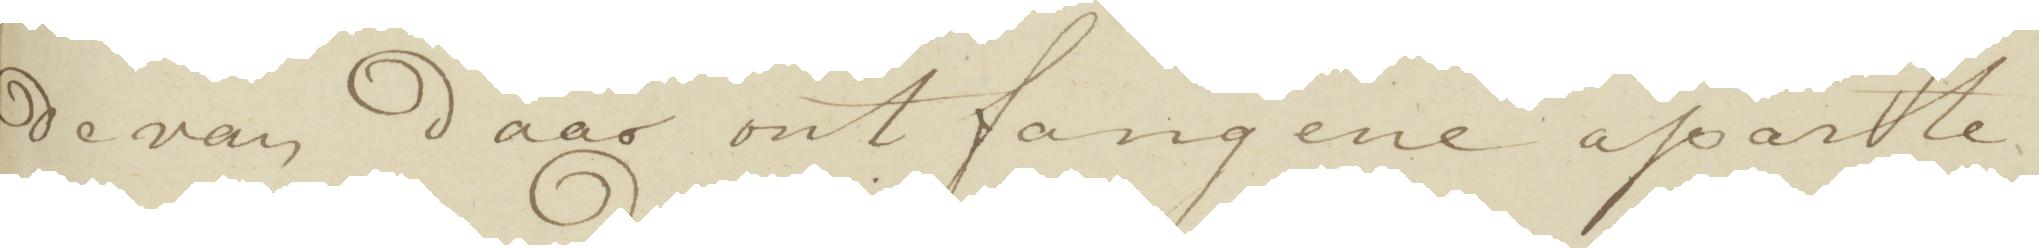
de van daar ontfangene aparte
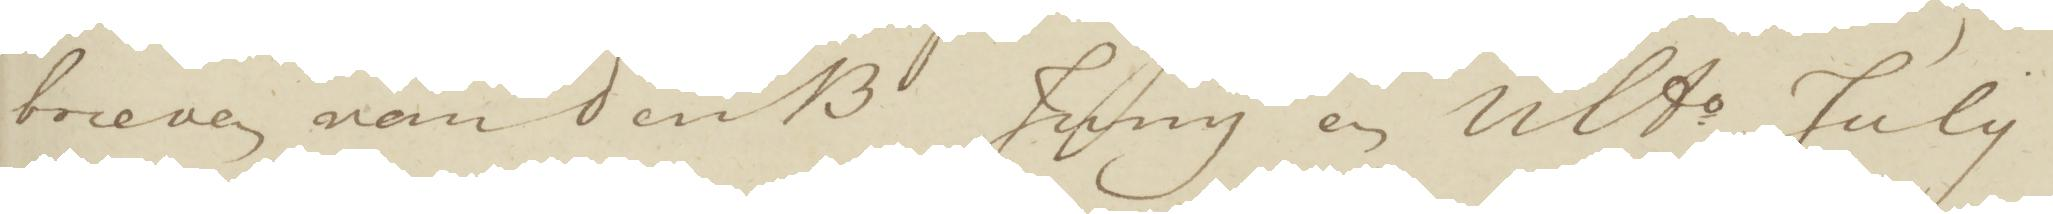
brieven van den 13 Junij en Ult=o Julij
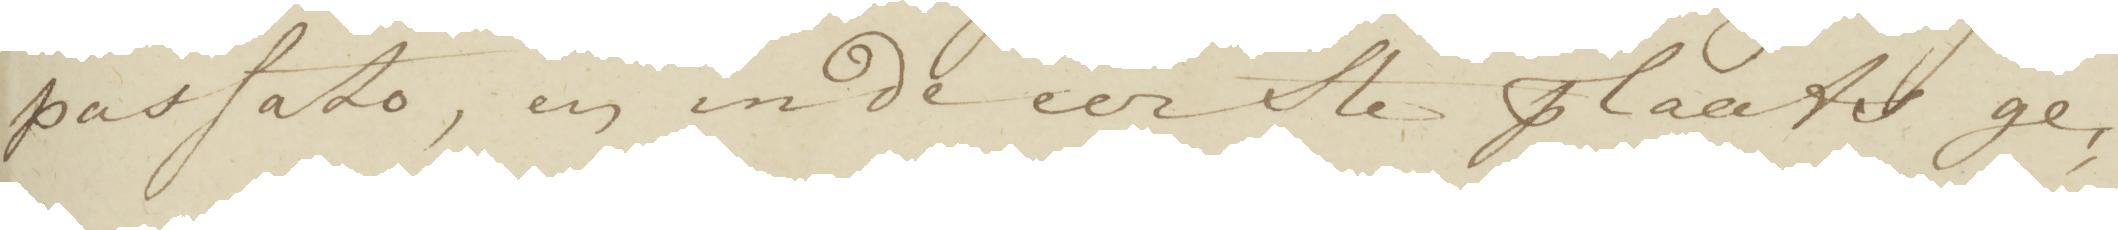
passato, en in de eerste plaats ge„
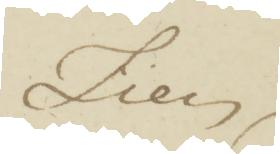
zien
